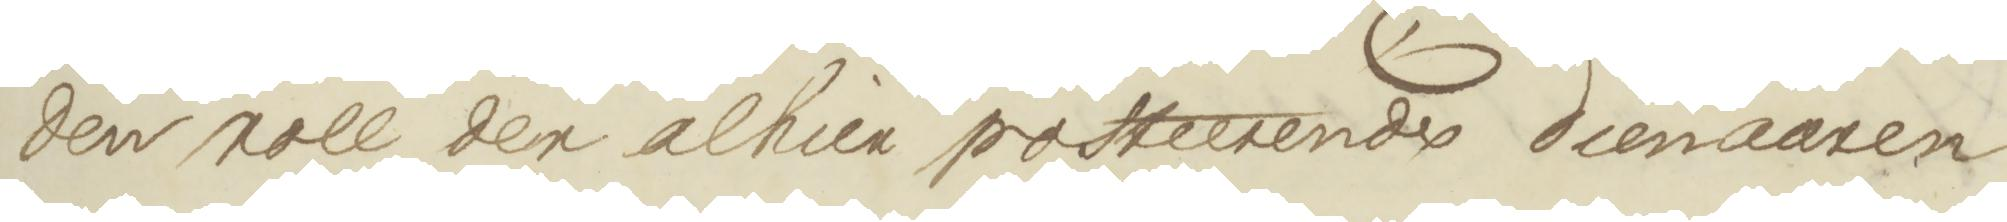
den roll der alhier posteerende dienaaren
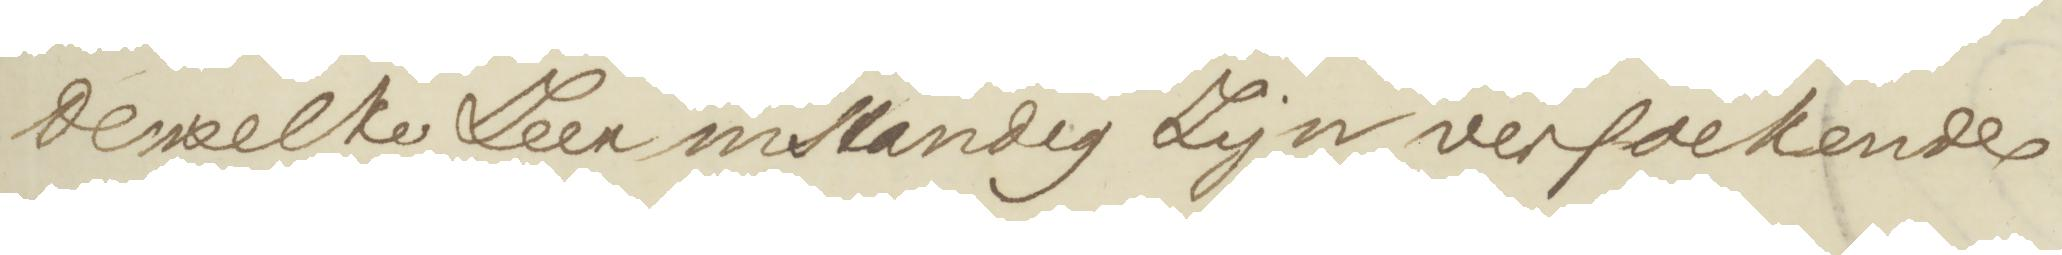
dewelke zeer instandig zijn versoekende
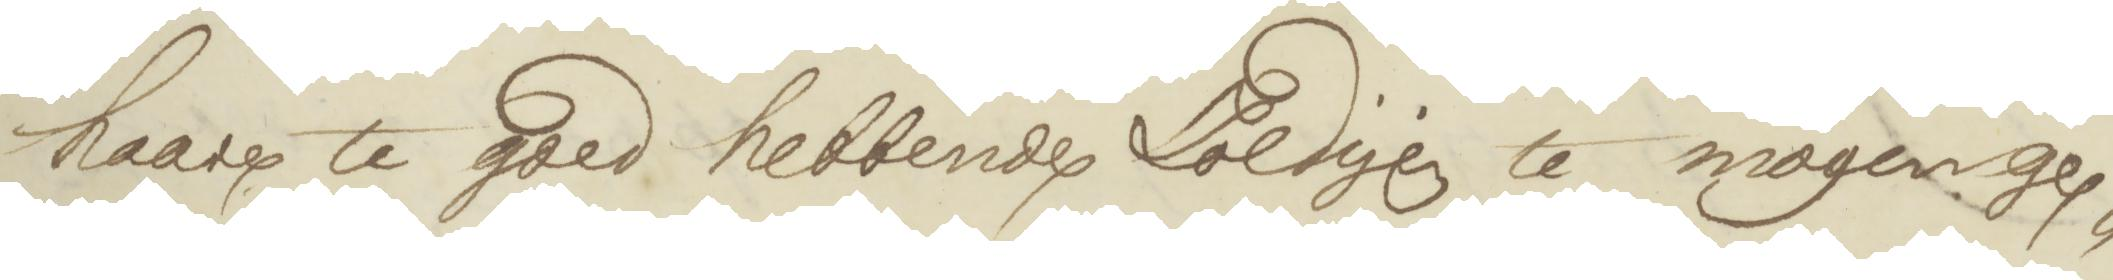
haare te goed hebbende zoldijen te mogen ge
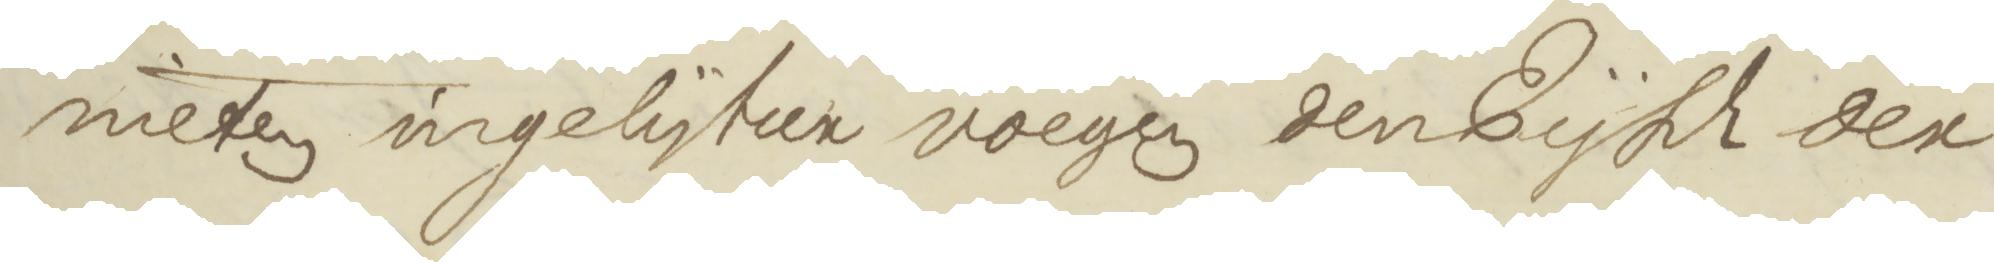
nieten ingelijker voegen den Eijsch der
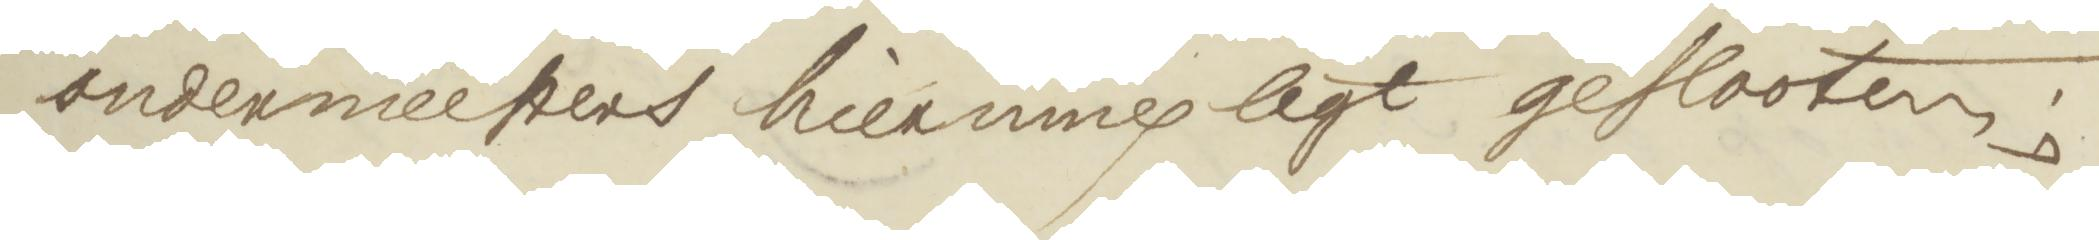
ondermeesters hierinne legt geslooten;
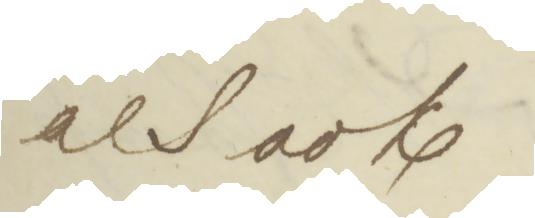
als ook
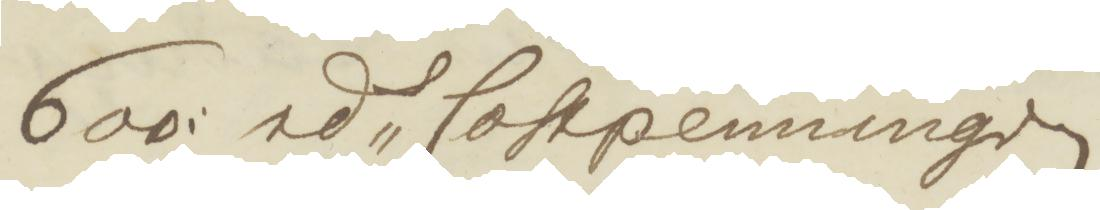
600: rd„s Costpenningen
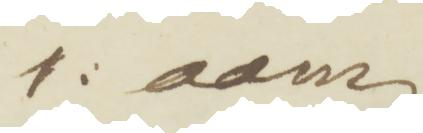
1: aam
